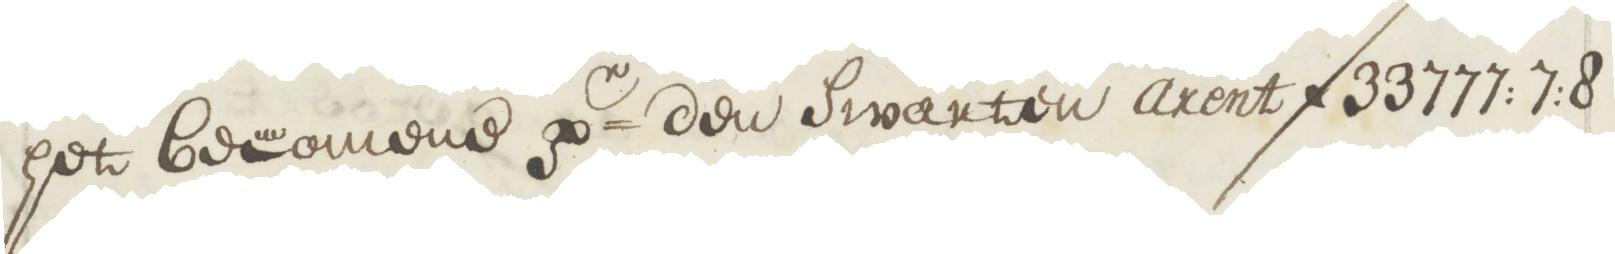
het becomene p=r den Swarten Arent ƒ 33777:7:8
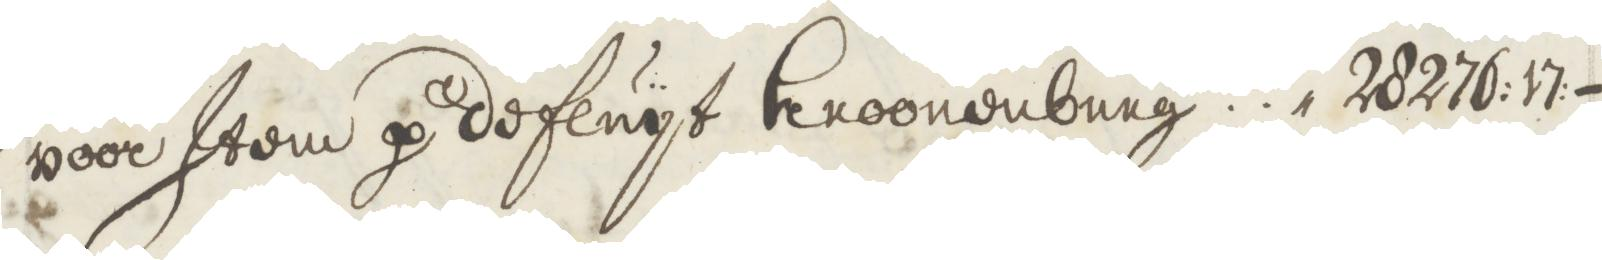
voor Jtem op de fluijt kroonenburg . . „ 28276:17:—
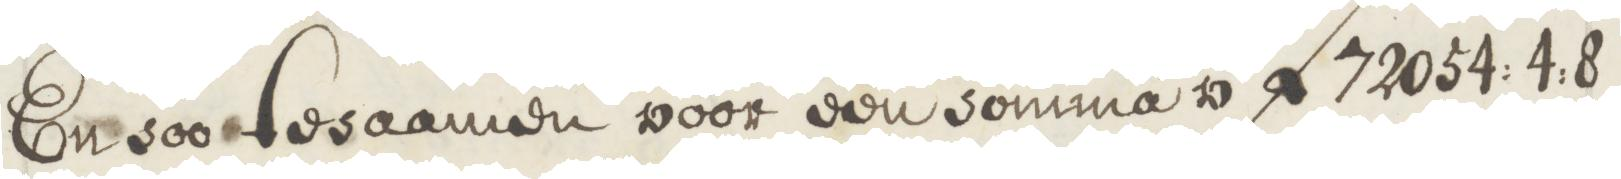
En soo tesaamen voor een somma v ƒ 72054:4:8
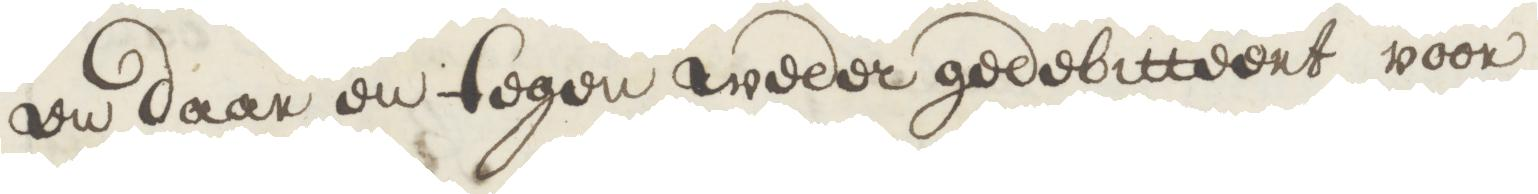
en daar en tegen weder gedebitteert voor
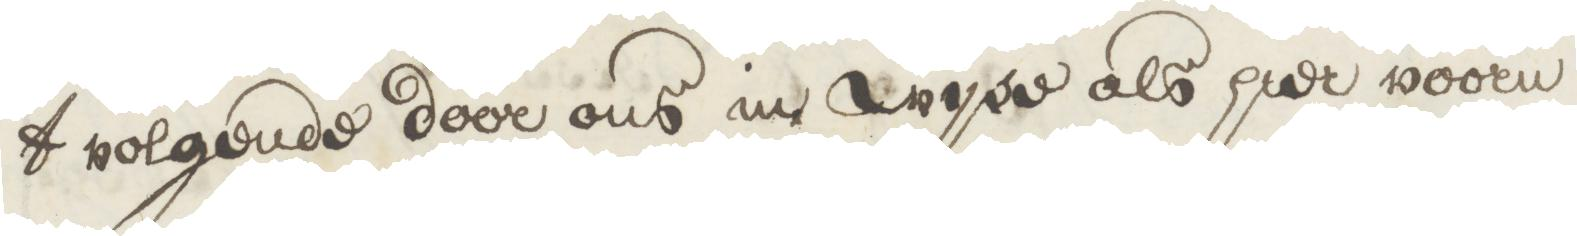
't volgende door ons in wijse als hier voorn
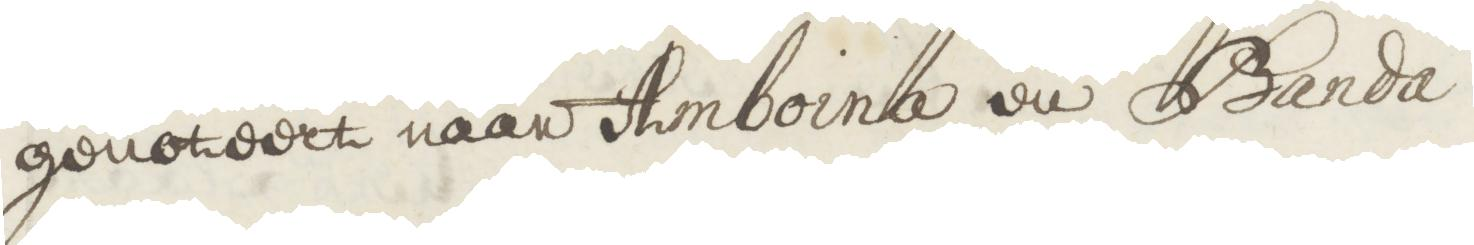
genoteert naar Amboina en Banda
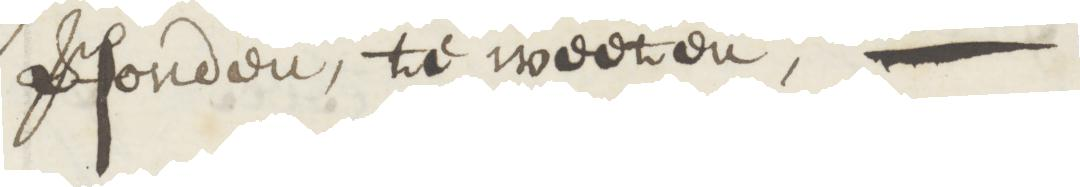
versonden, te weeten, —
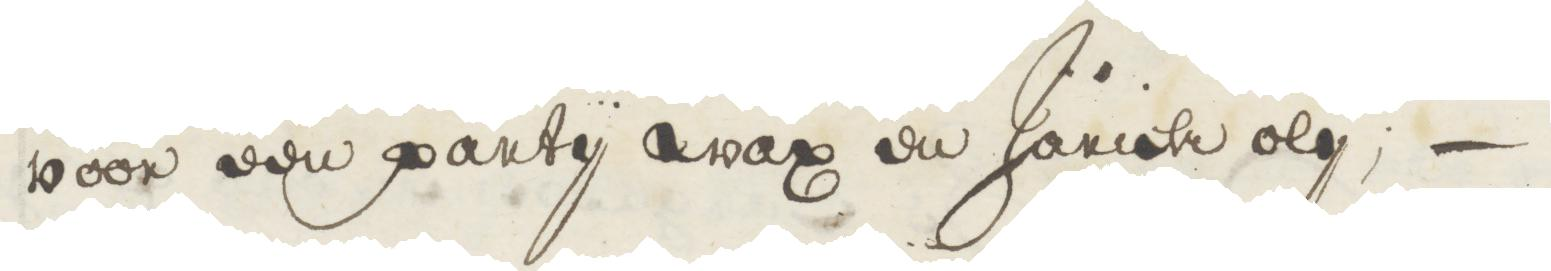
voor een partij wax en Jarick olij;-
